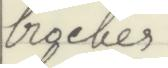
broches
